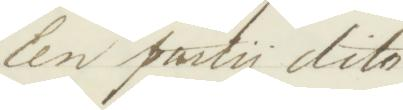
Een partij dito
